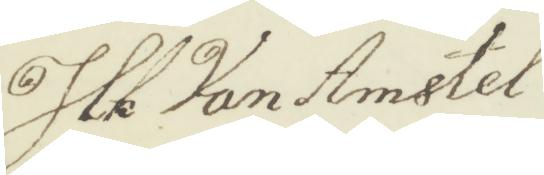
Jlk Van Amstel
